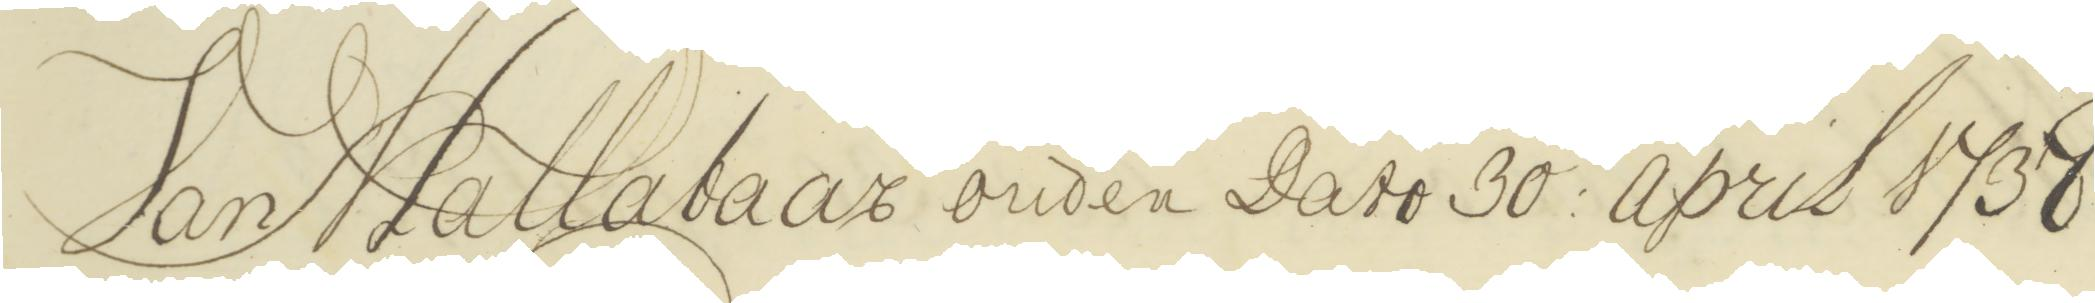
Van Mallabaar onder Dato 30:e april 1738
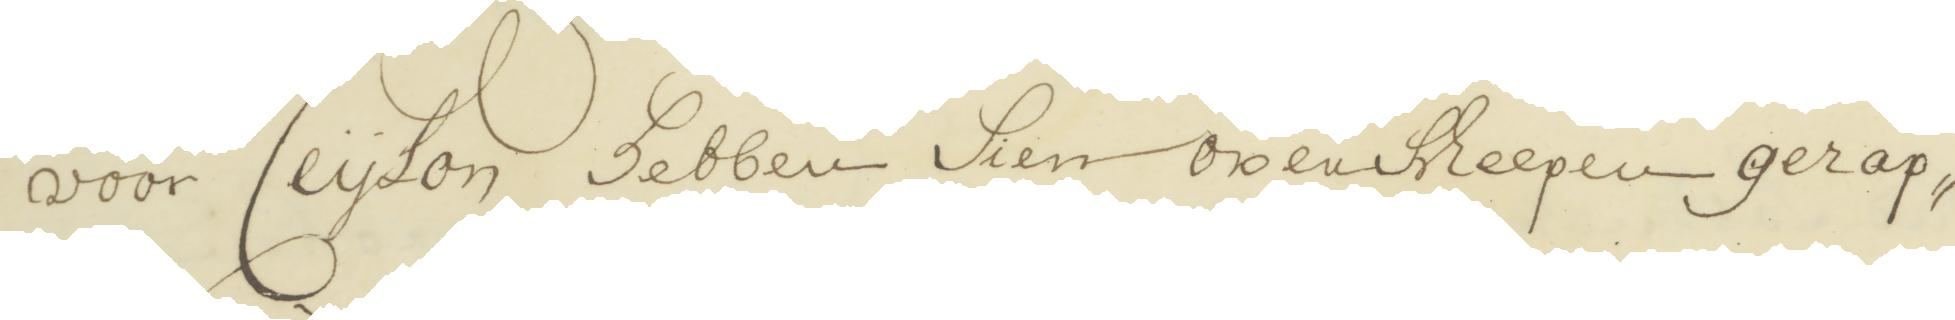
voor Ceijlon hebben sien overscheepen gerap„
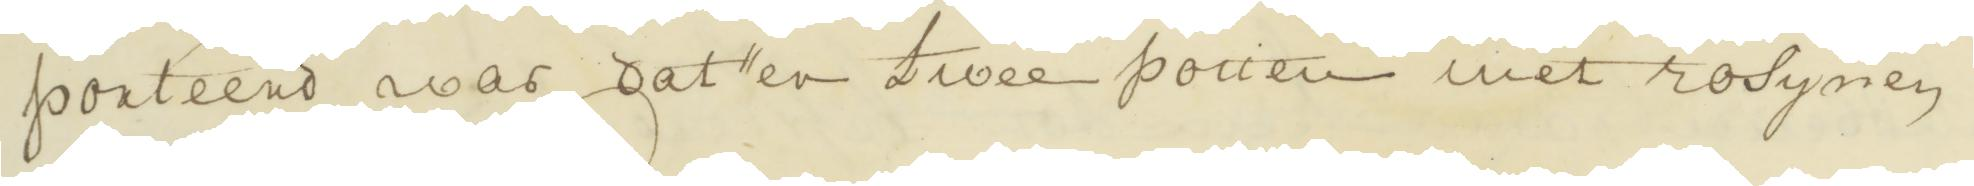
porteerd was dat 'er twee potten met rosijnen
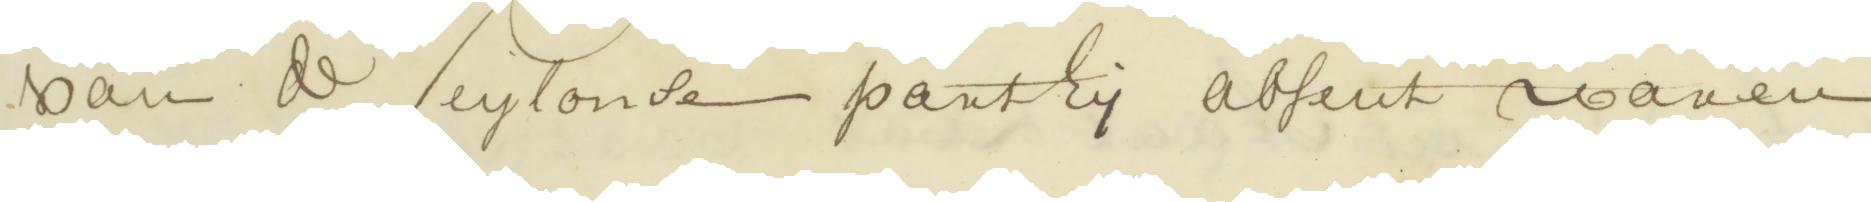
van de Ceijlonse parthij absent waren
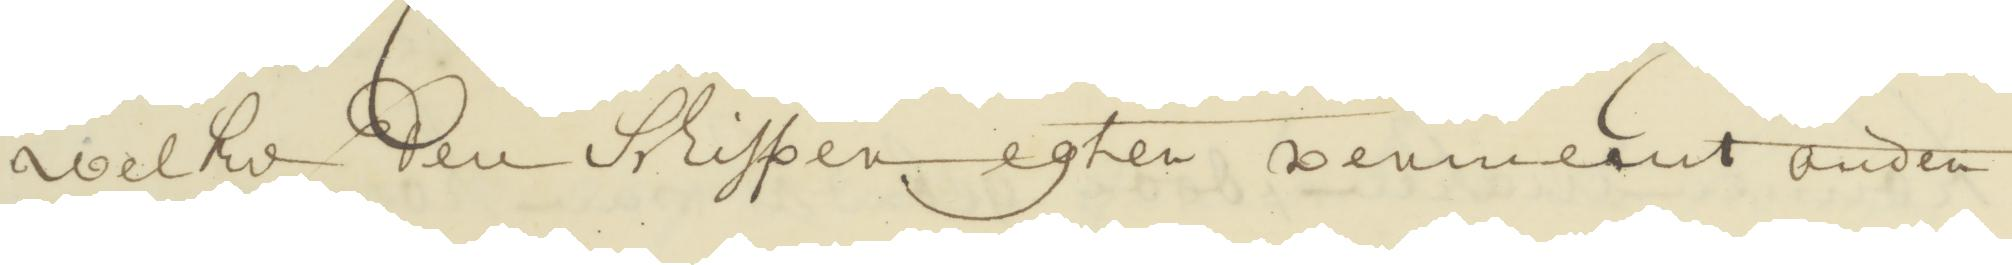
welke den schipper egter vermeent onder
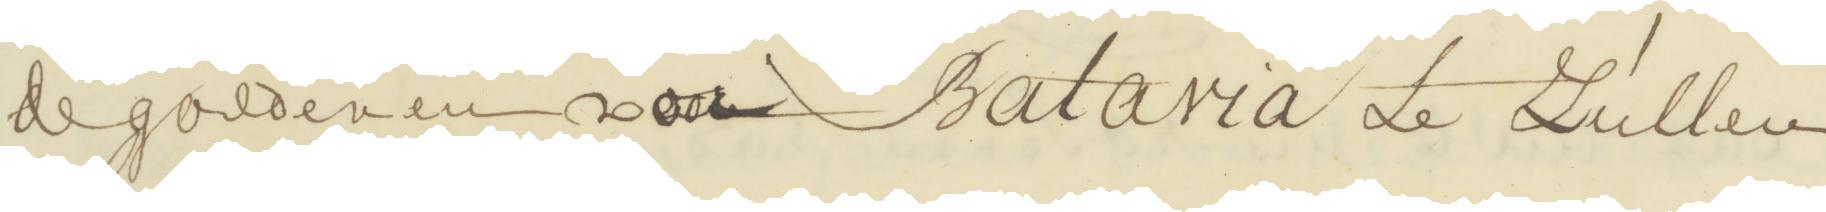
de goederen voor Batavia te zullen
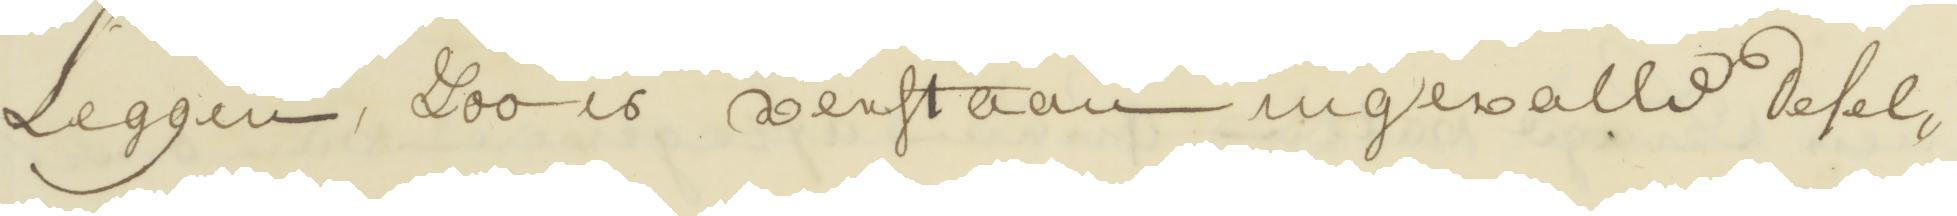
leggen, zoo is verstaan ingevalle desel„
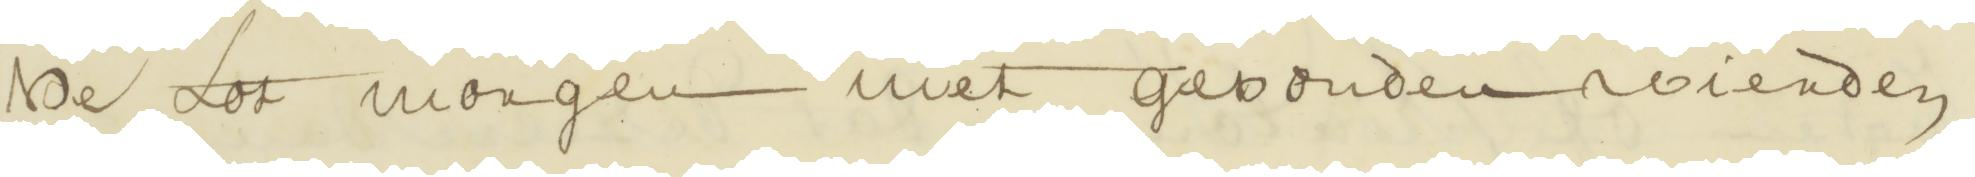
de tot morgen niet gevonden wierden
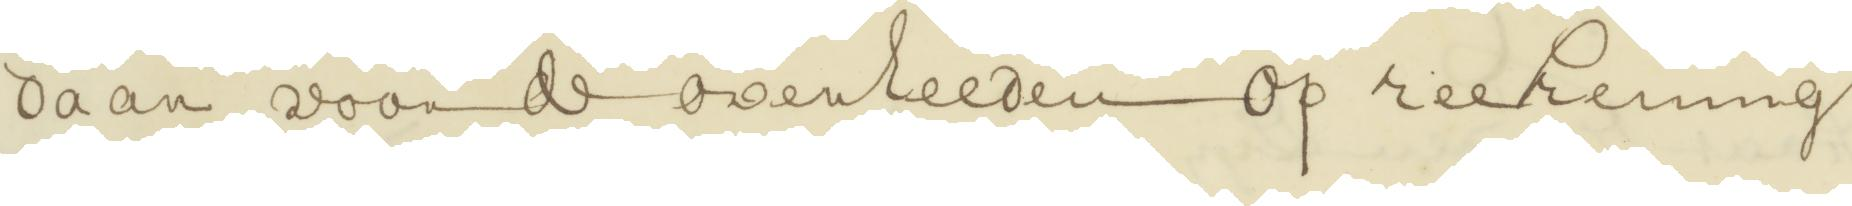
daar voor de overheeden op reekening
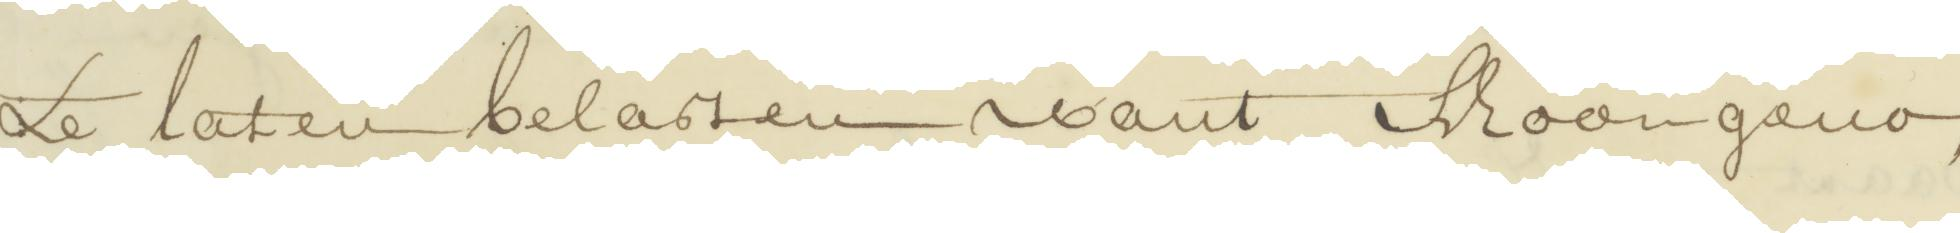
te laten belasten want schoon geno„
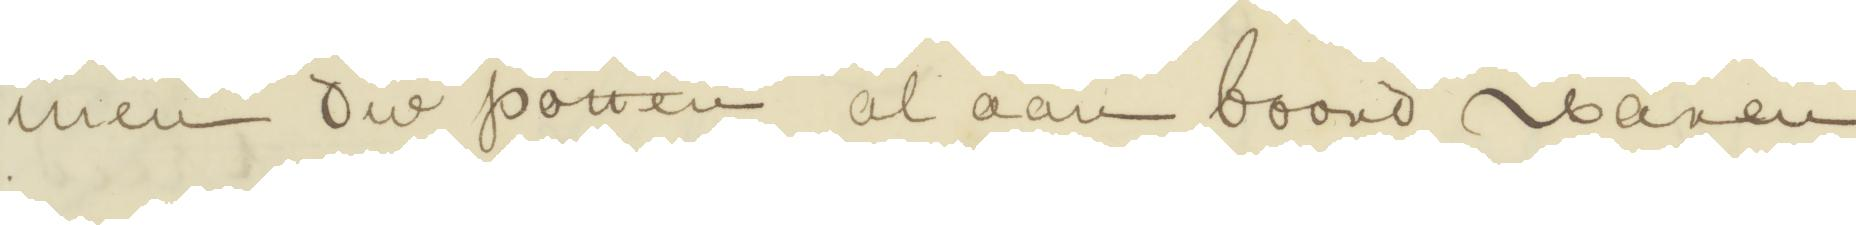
men die potten al aan boord waren
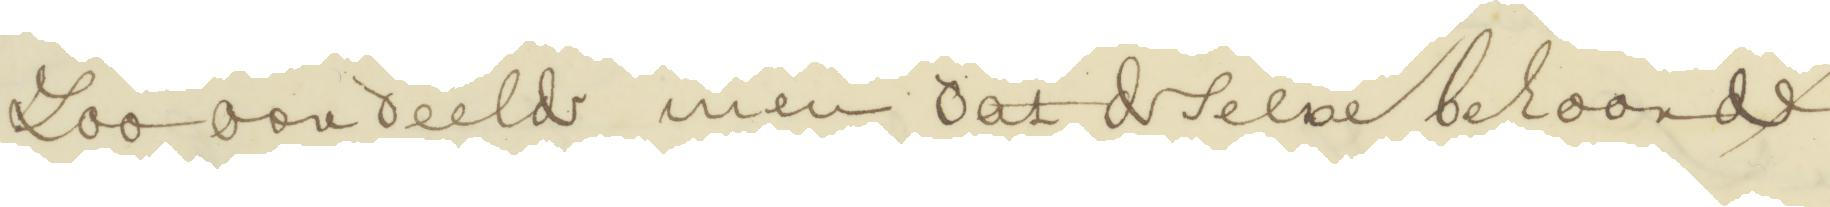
zoo oordeelde men dat deselve behoorde
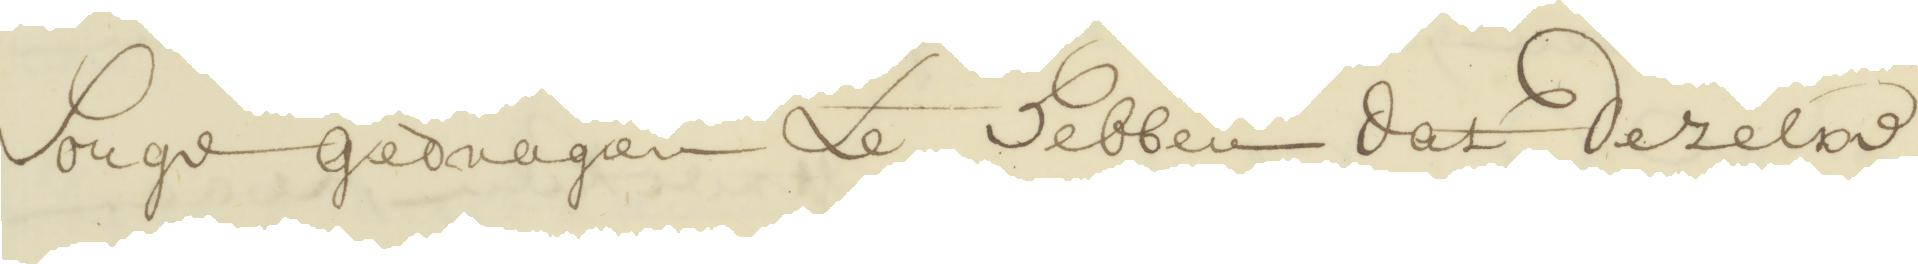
sorge gedragen te hebben dat dezelve
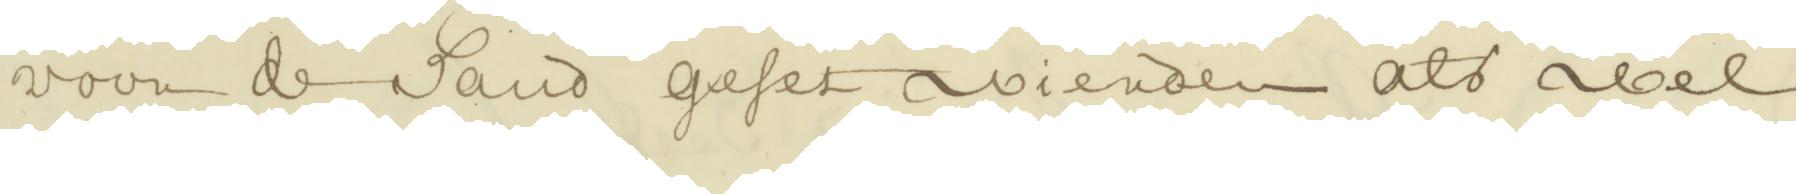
voor de hand geset wierden als wel
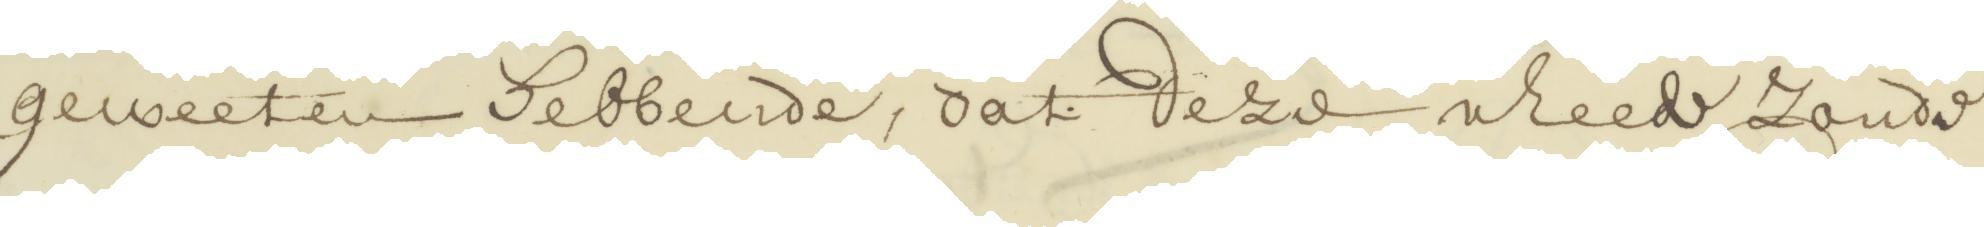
geweeten hebbende, dat deze rheede zoude
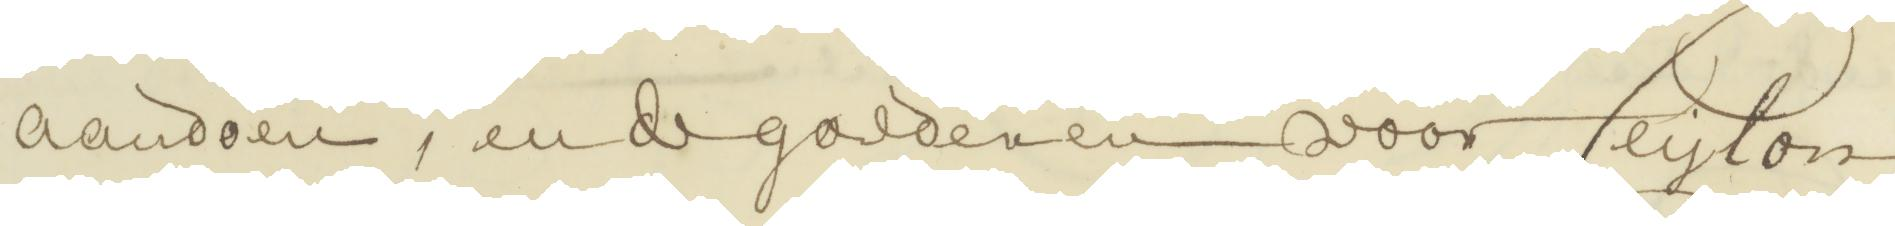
aandoen, en de goederen voor Ceijlon
